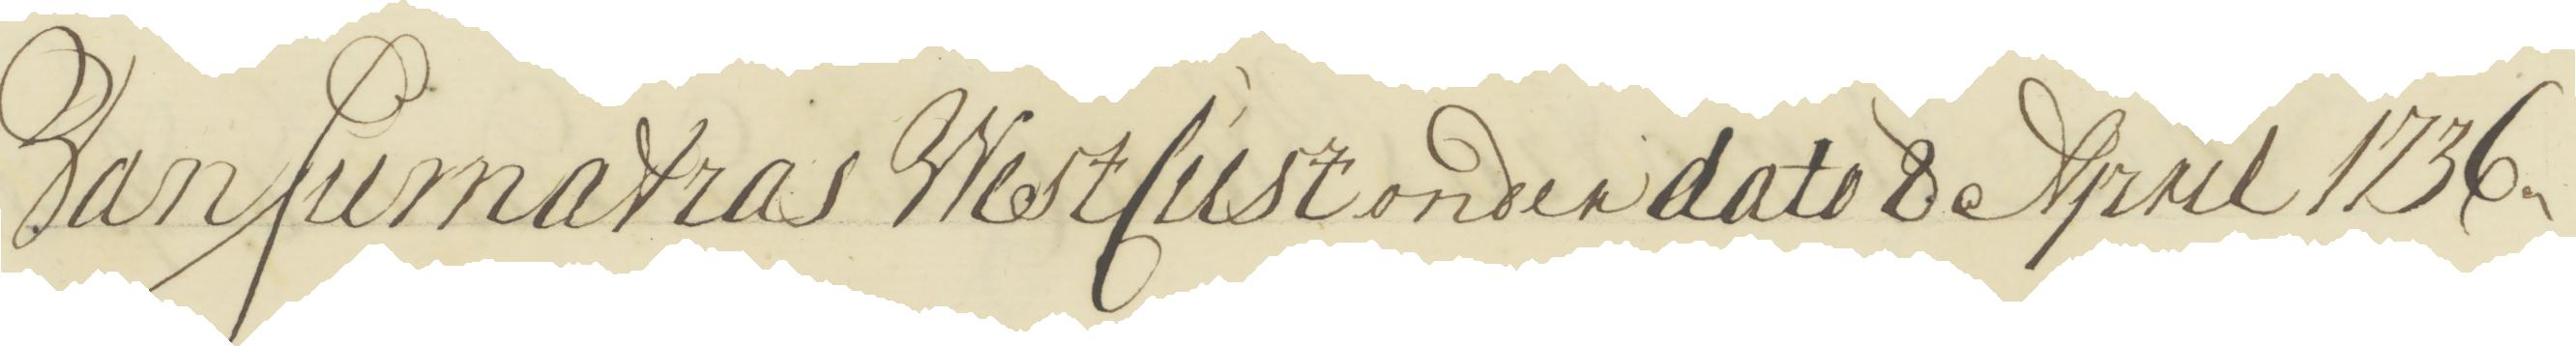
Van Sumatras West Cust onder dato 8 April 1736.
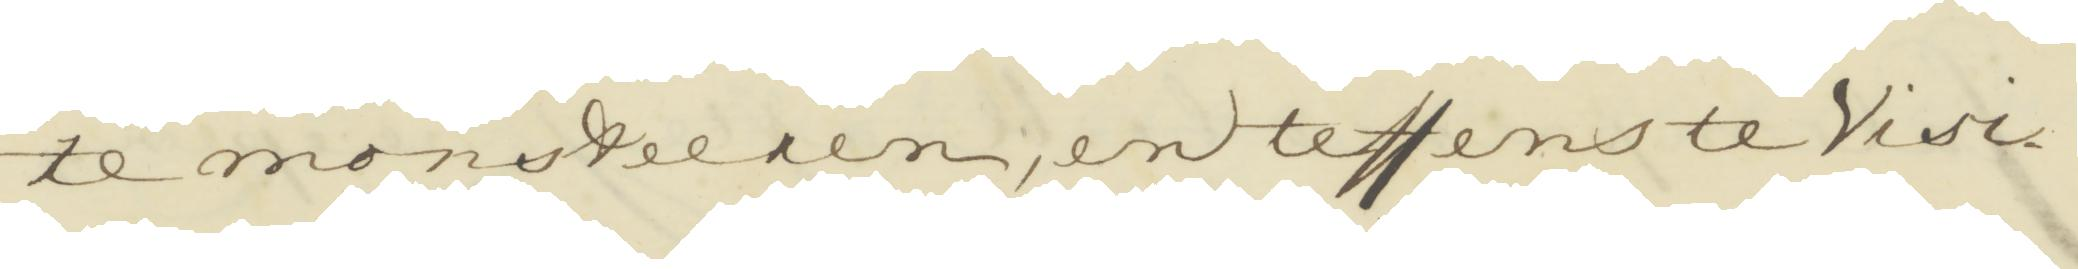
te monsteeren, en teffens te Visi=
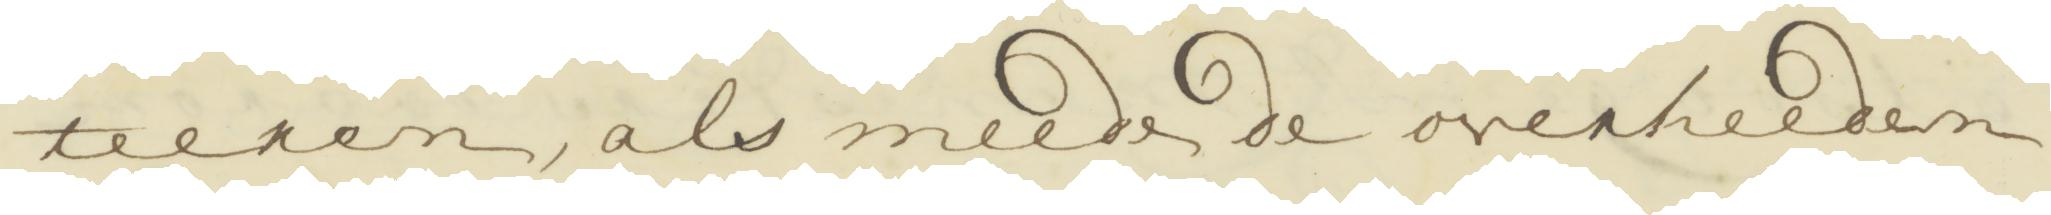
teeren, als meede de overheeden
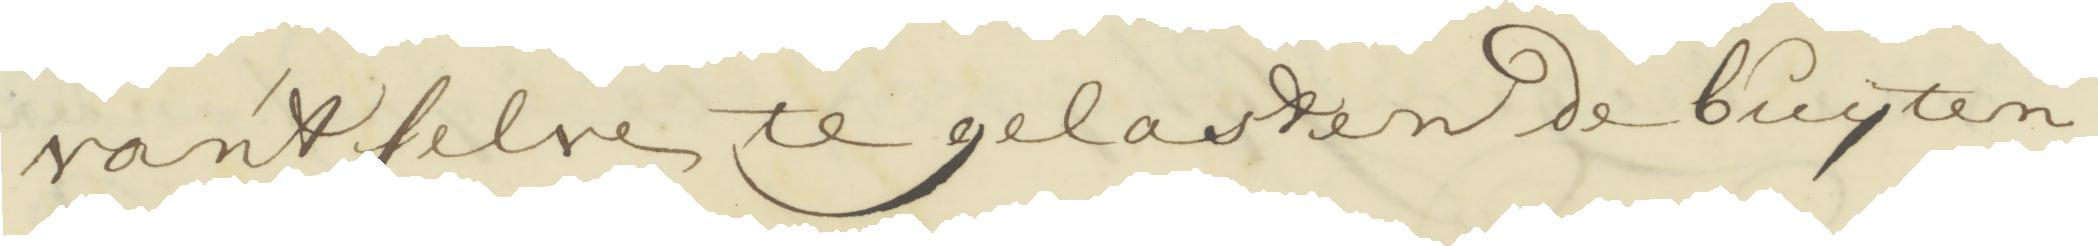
van 't selve te gelasten de buijten
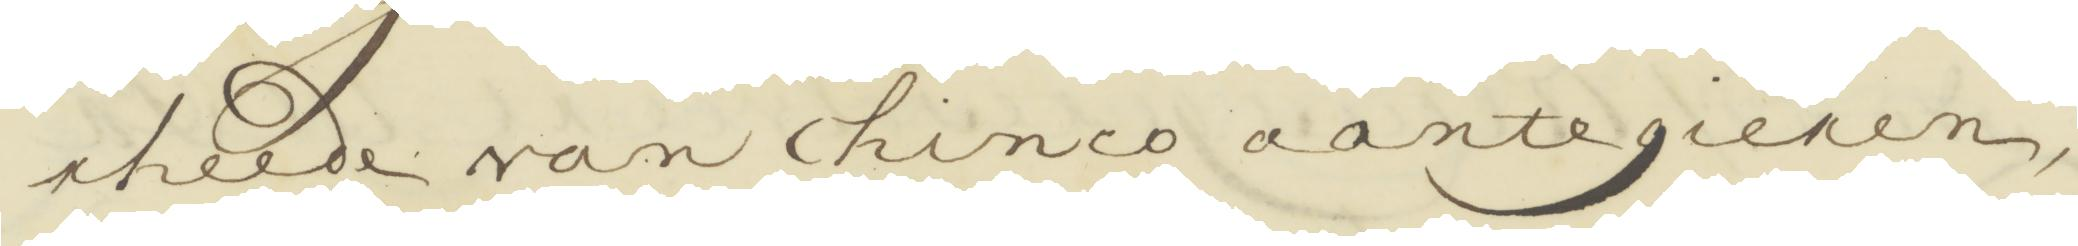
rheede van chinco aan te gieren,
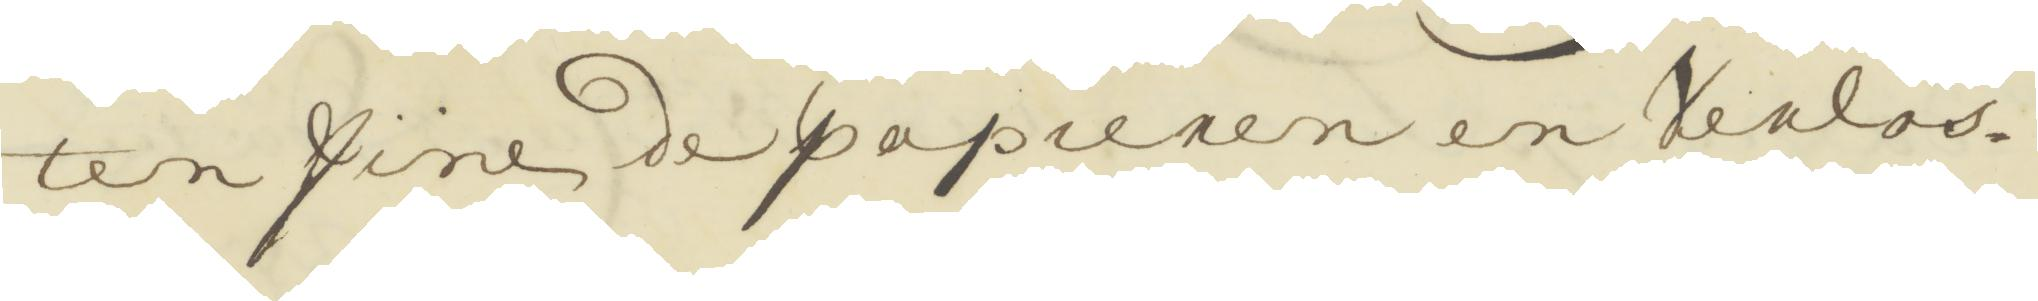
ten fine de papieren en Verlos=
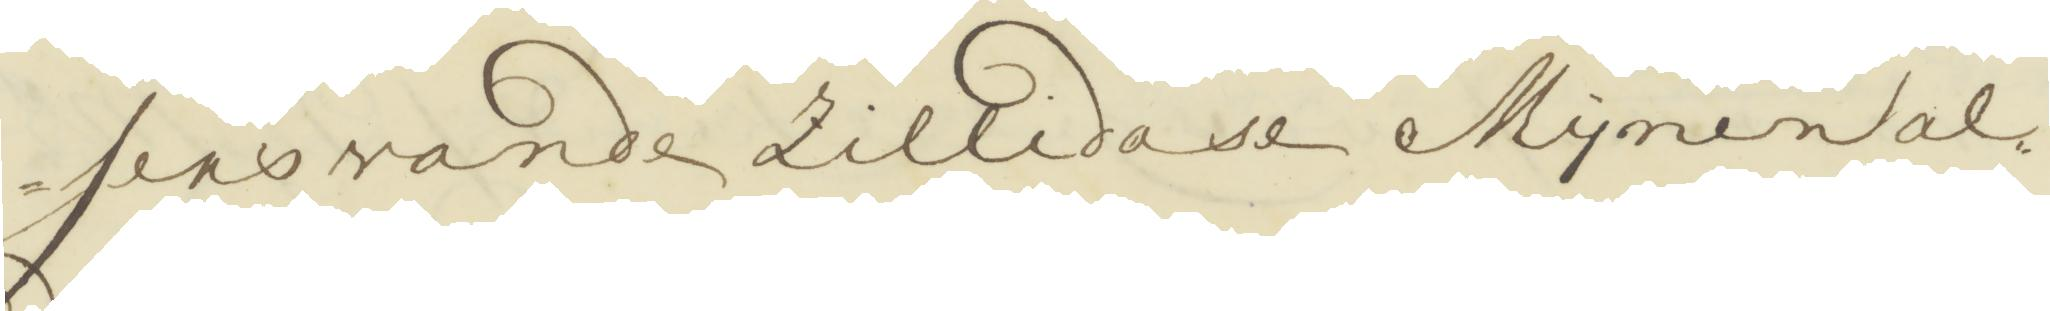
=sers van de Zillidase Mijnen al„
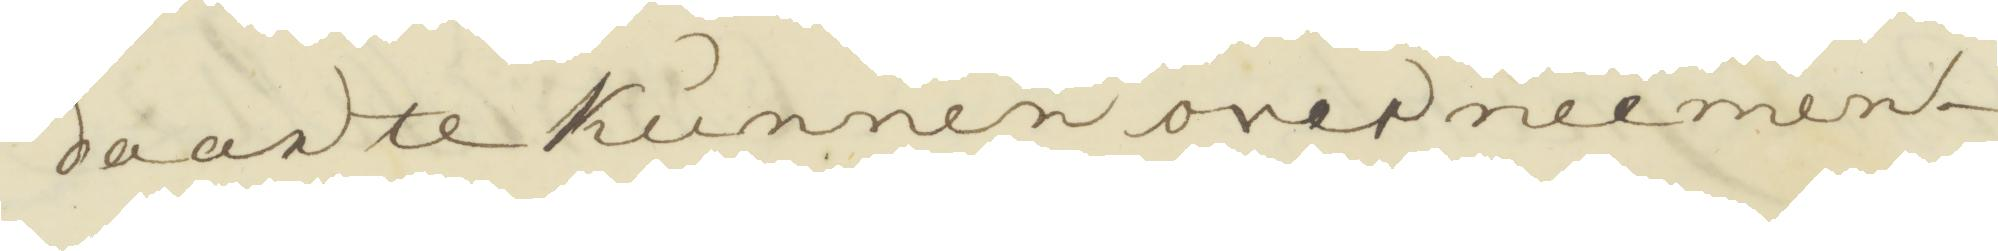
daar te kunnen overneemen-
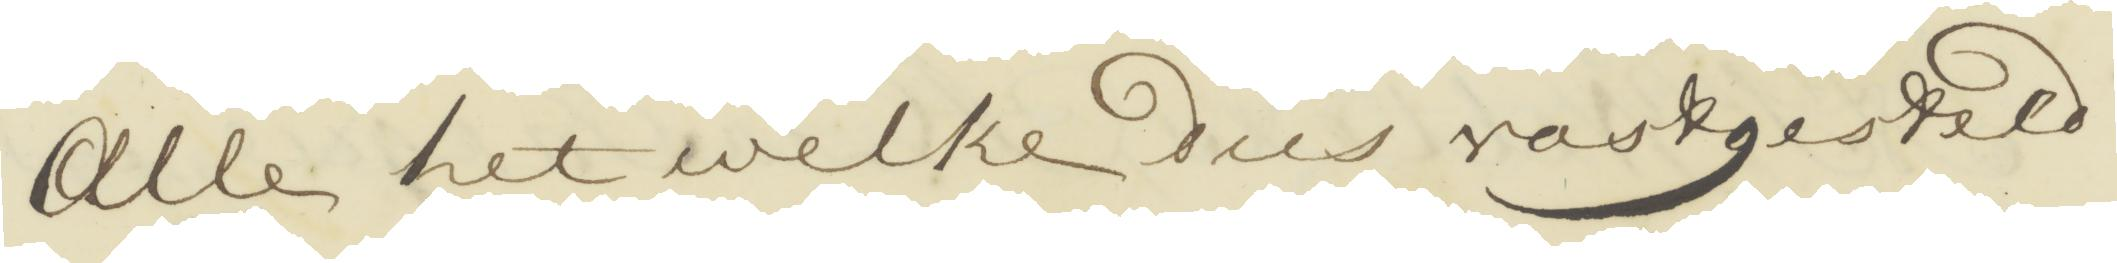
Alle het welke dus vastgesteld
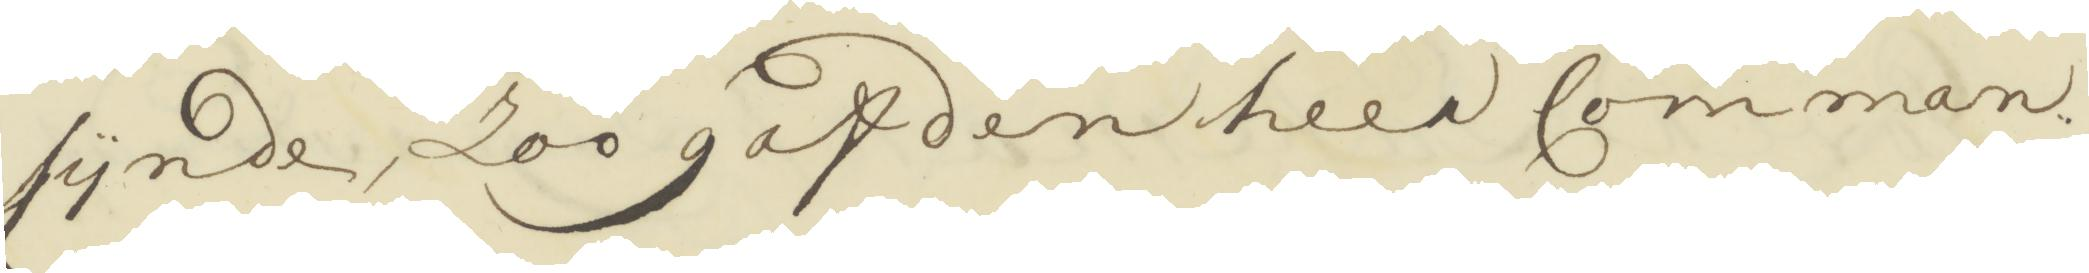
sijnde, zoo gaf den heer Comman„
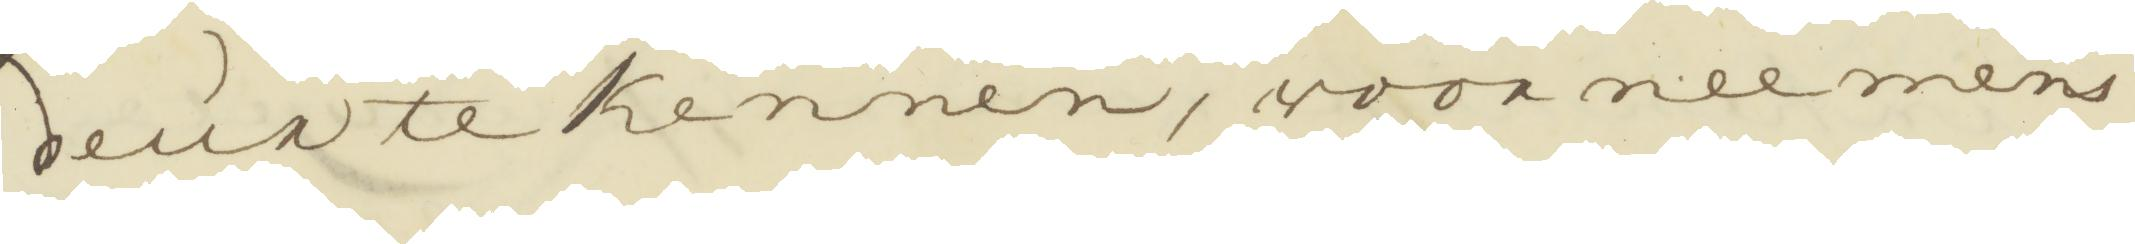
deur te kennen, voor neemens
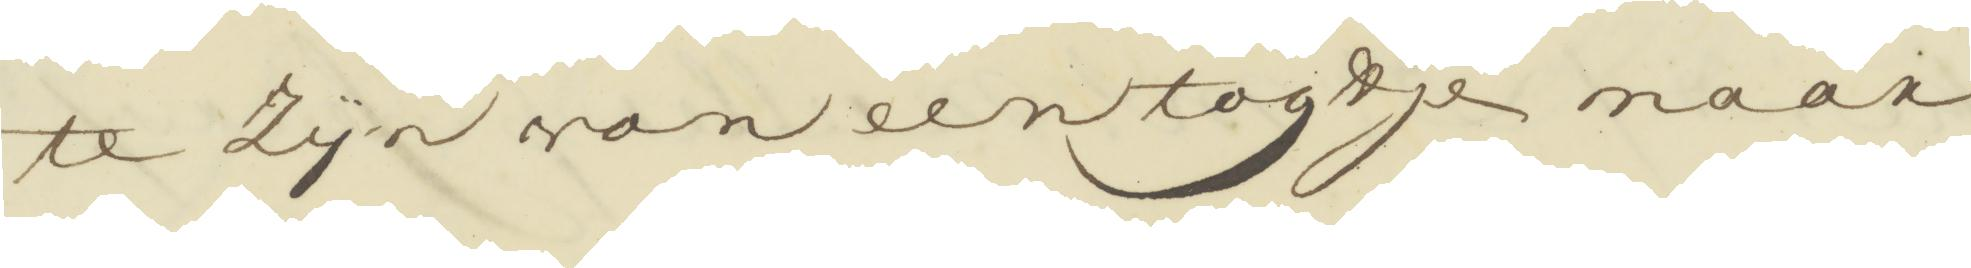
te zijn van een togtje naar
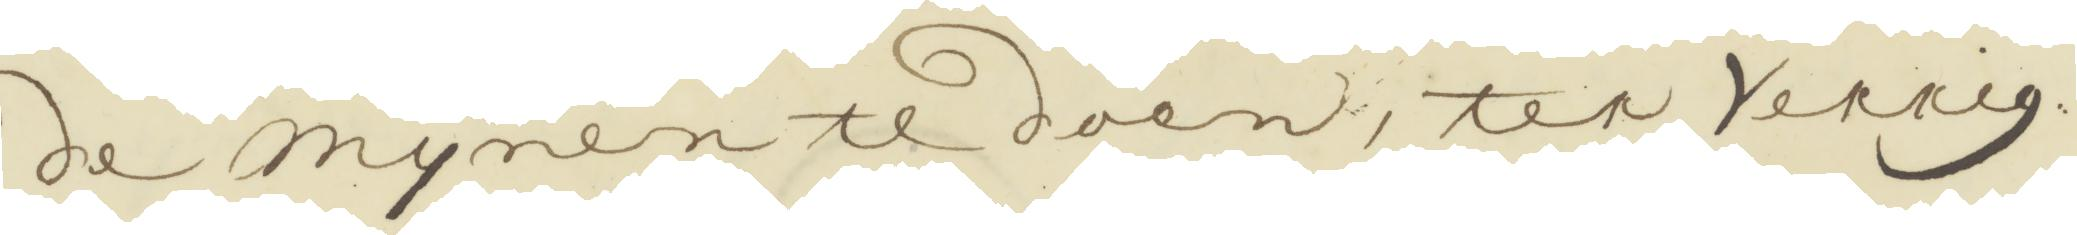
de mijnen te doen, ter verrig„
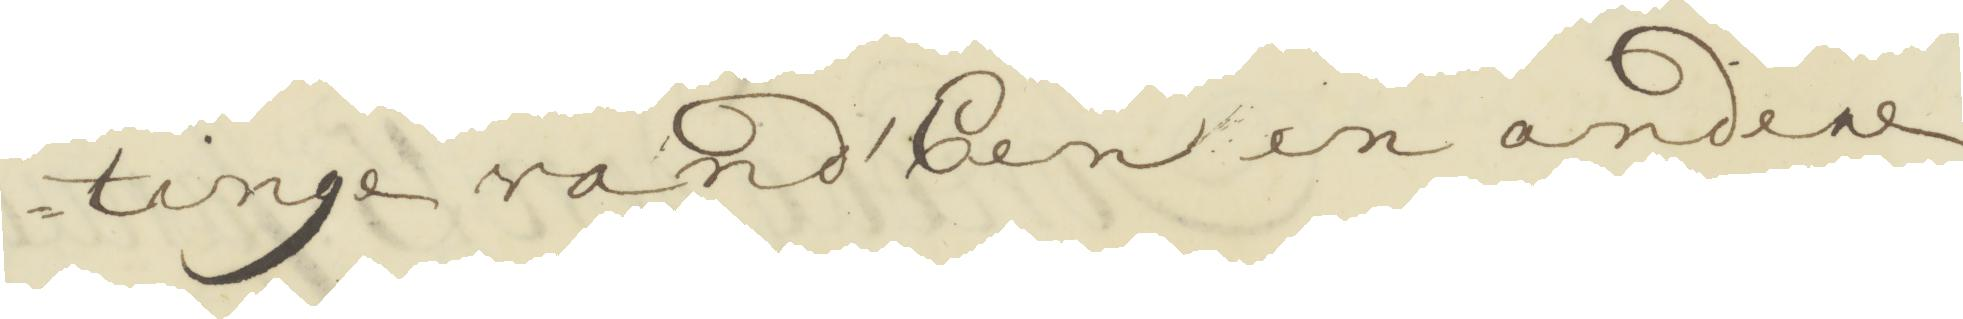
„tinge van d' Een en andere
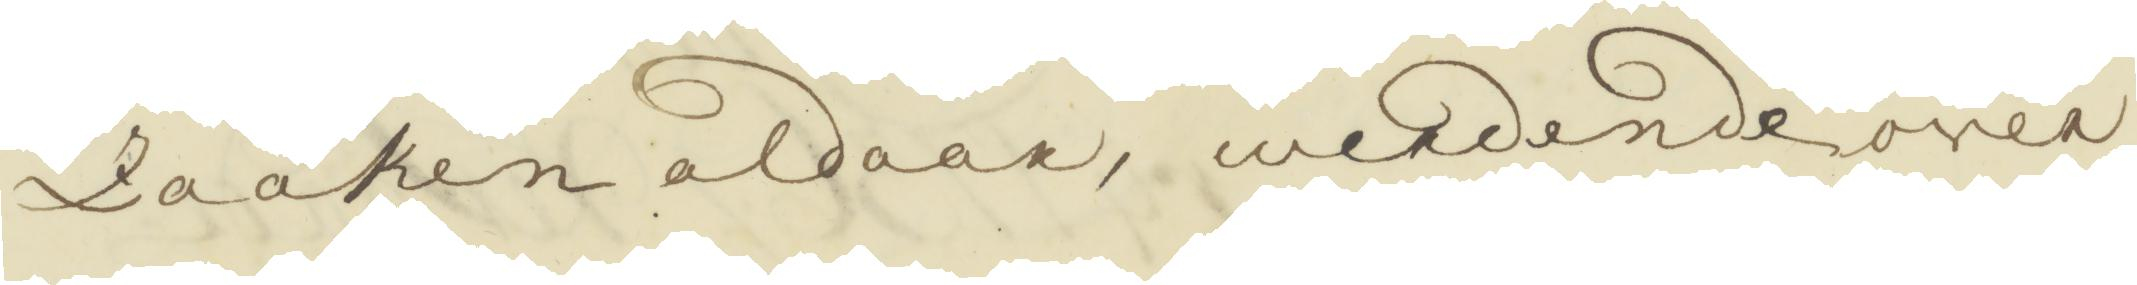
Zaaken aldaar, werden de over
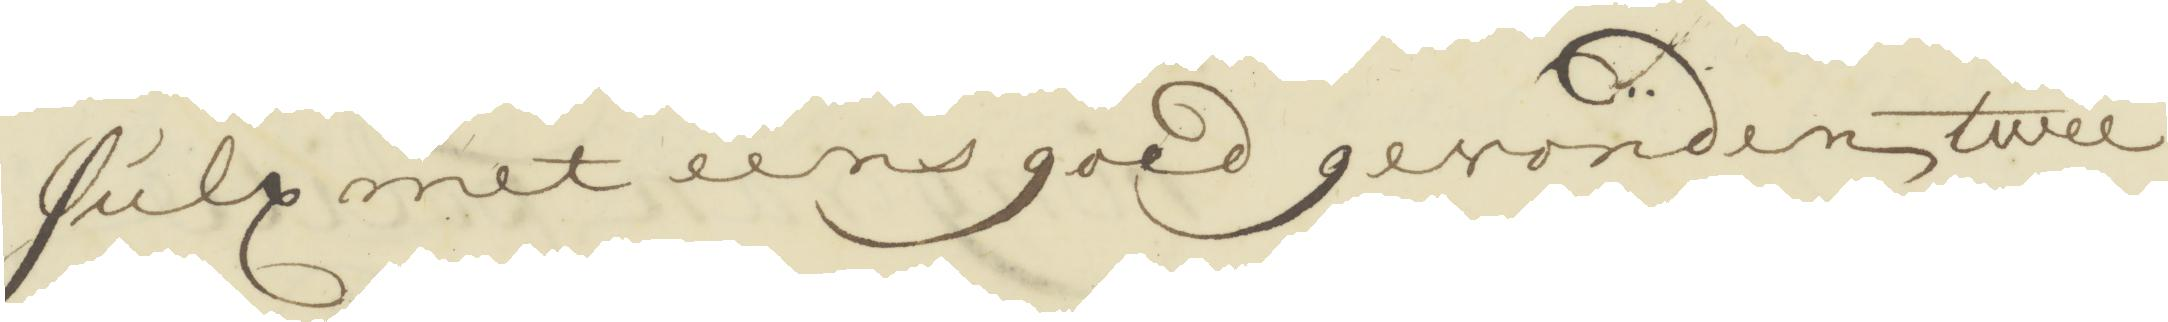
sulx met eens goed gevonden twee
